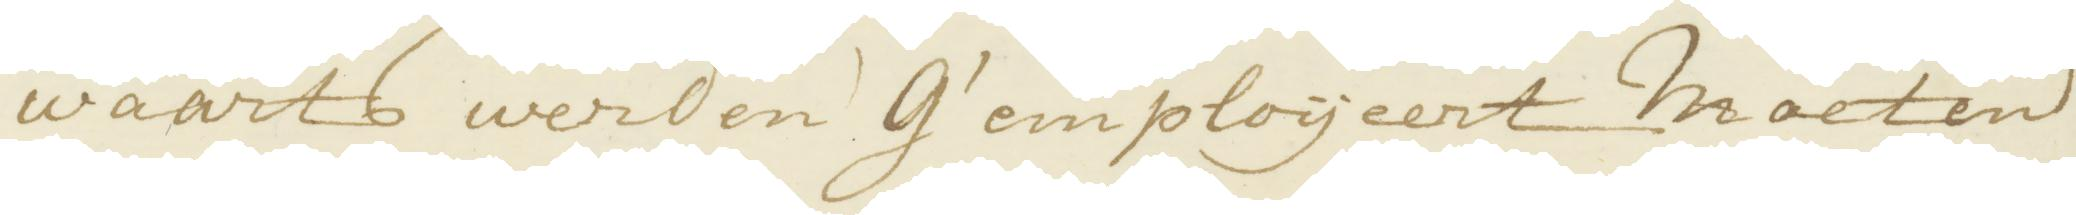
waarts werden g’emploijeert moeten
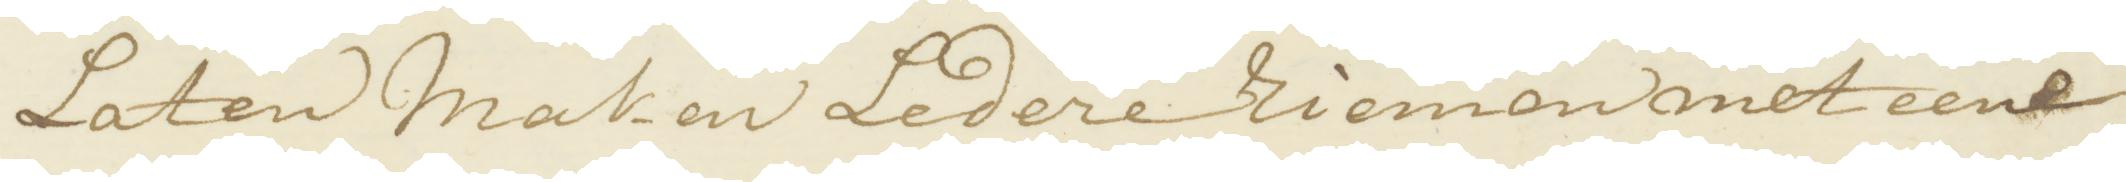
Laten maken Ledere riemen met eene
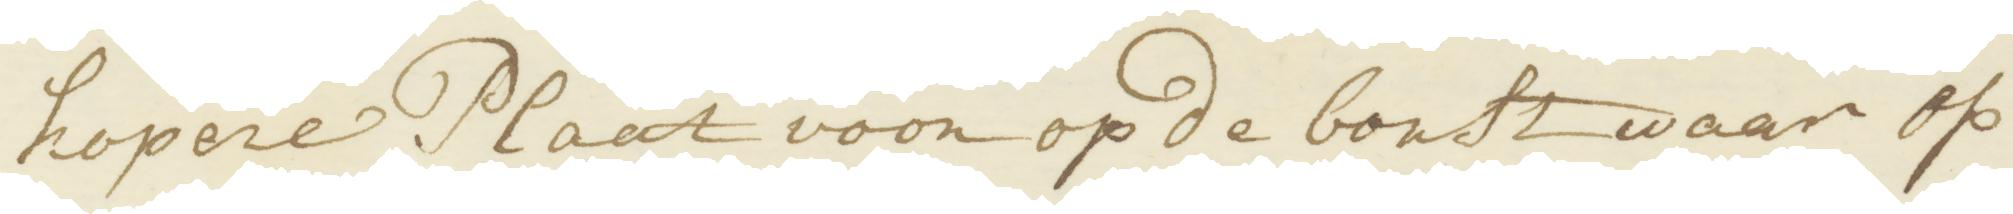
kopere Plaat voor op de borst waar op
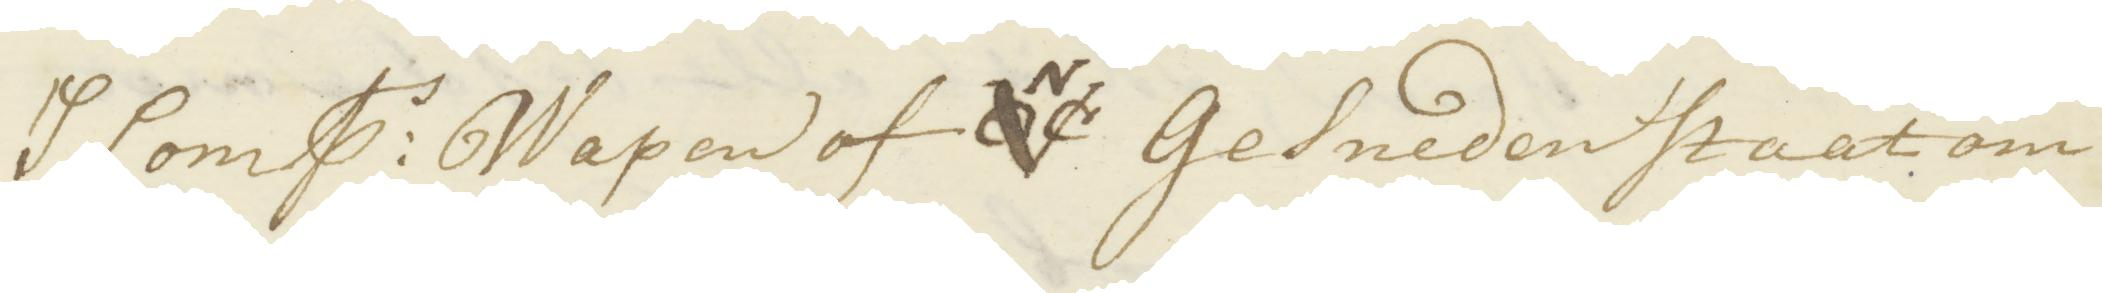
’s Comp:s Wapen of gesneden staat om
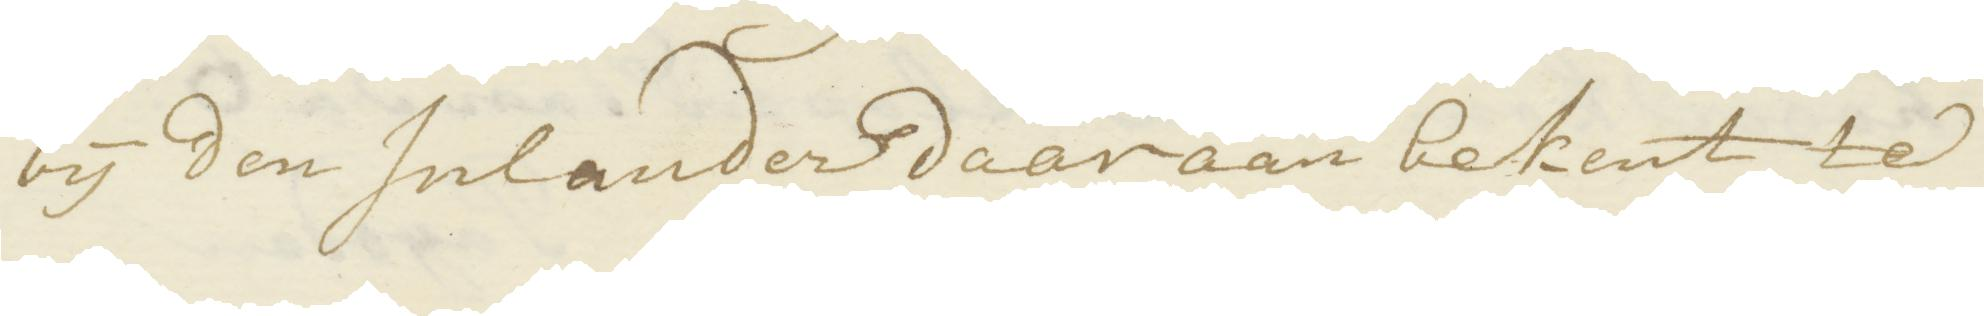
bij den jnlander daar aan bekent te
